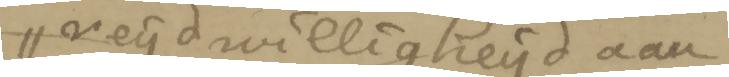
„reijdwilligheijd aan
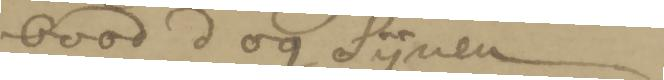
bood dog sijnen
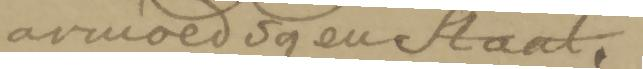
armoedigen staat.
